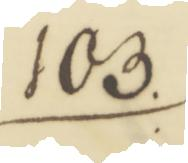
103.
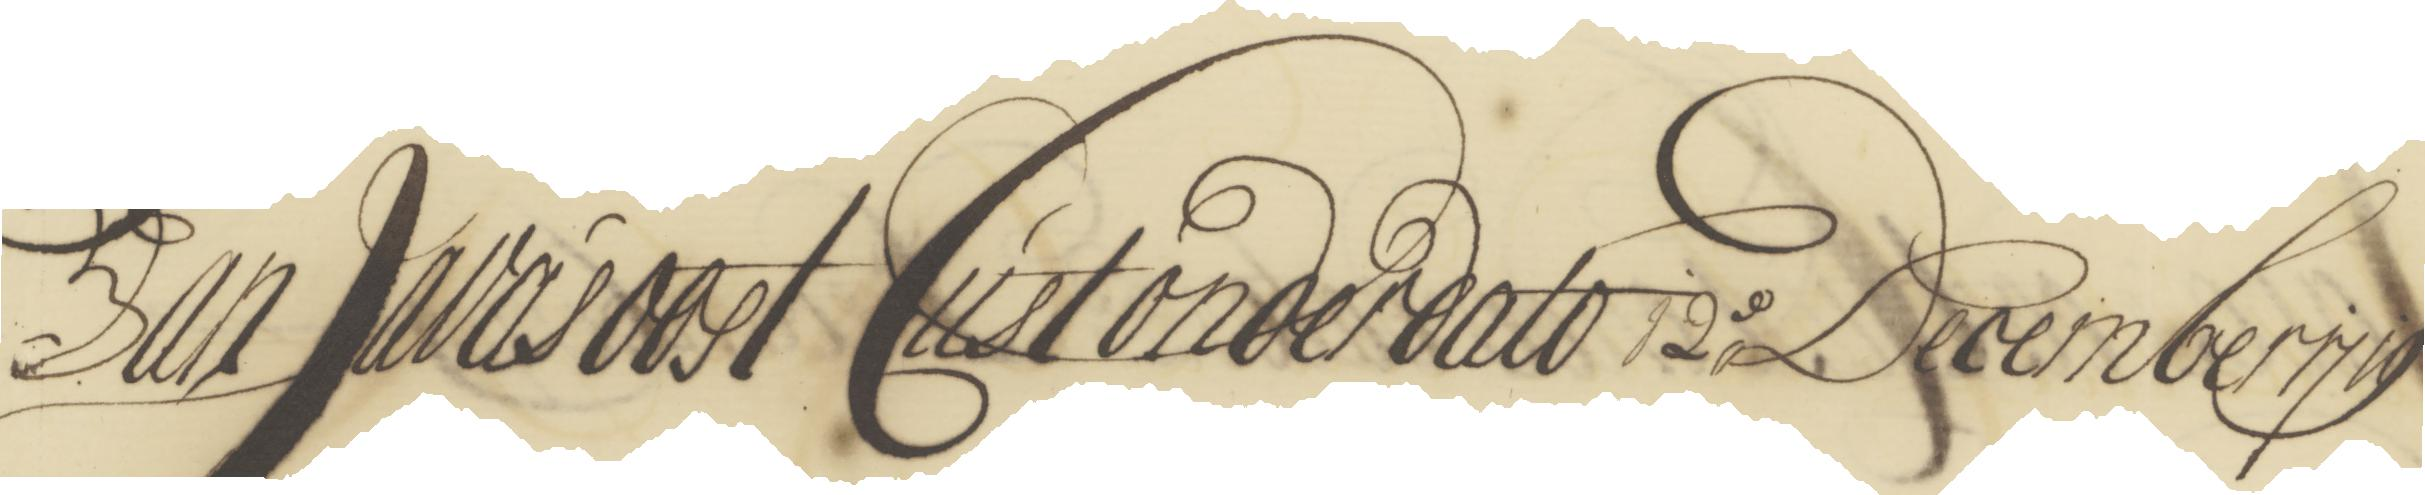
Van Java's oost Cust onder dato 12„e December 1719
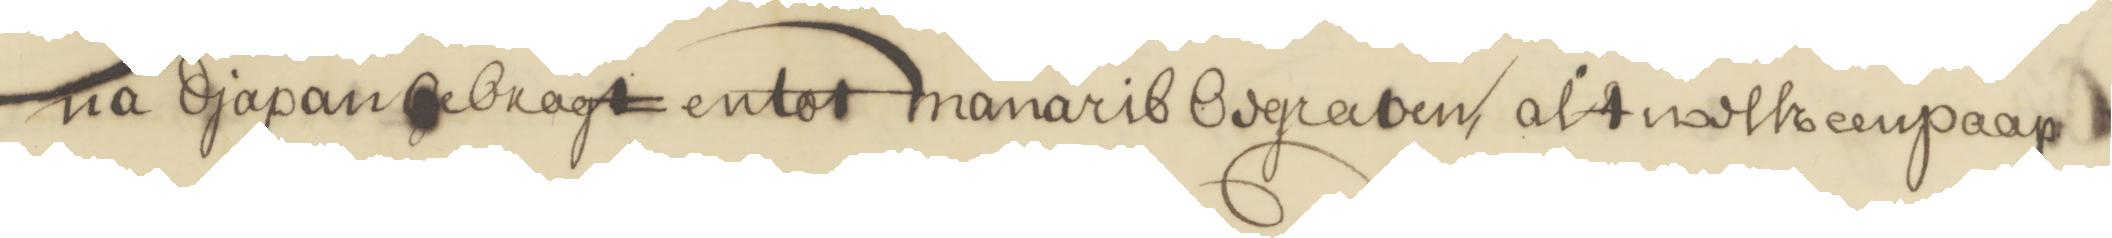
na djapan gebragt en tot manarib begraven, al ’t welk een paap
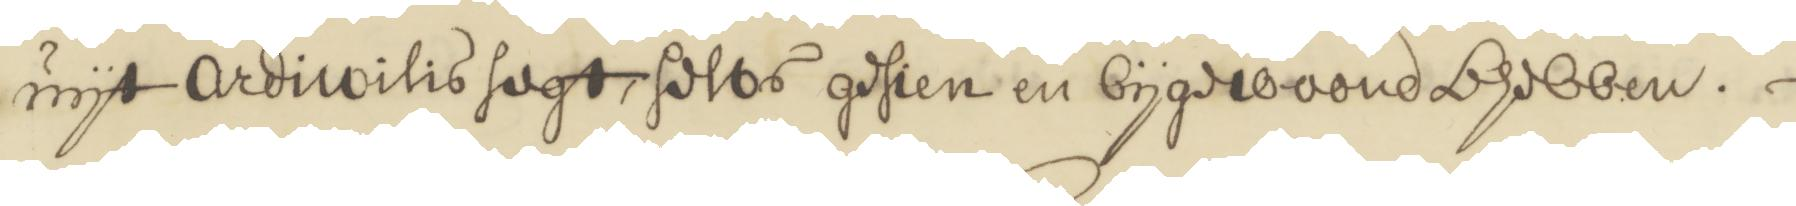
uijt ardiwilis segt, selvs gesien en bijgewoond te hebben. -
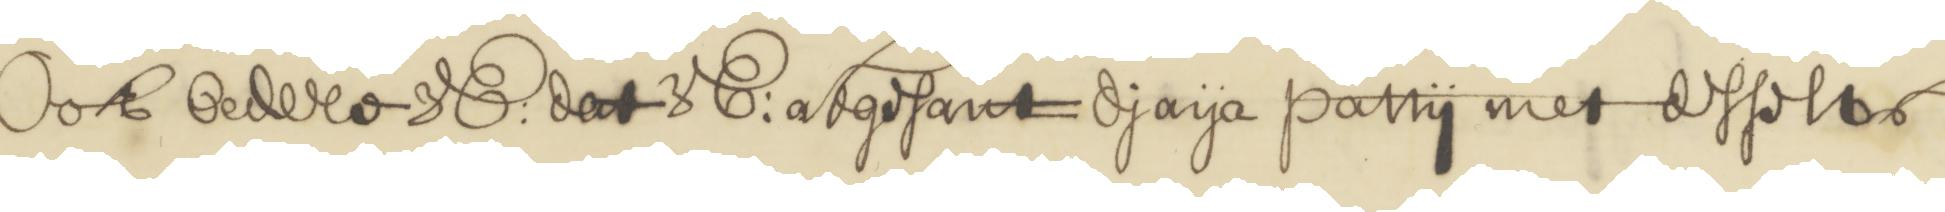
Ook bedeele VE: dat VE: afgesant djaija pattij met desselvs
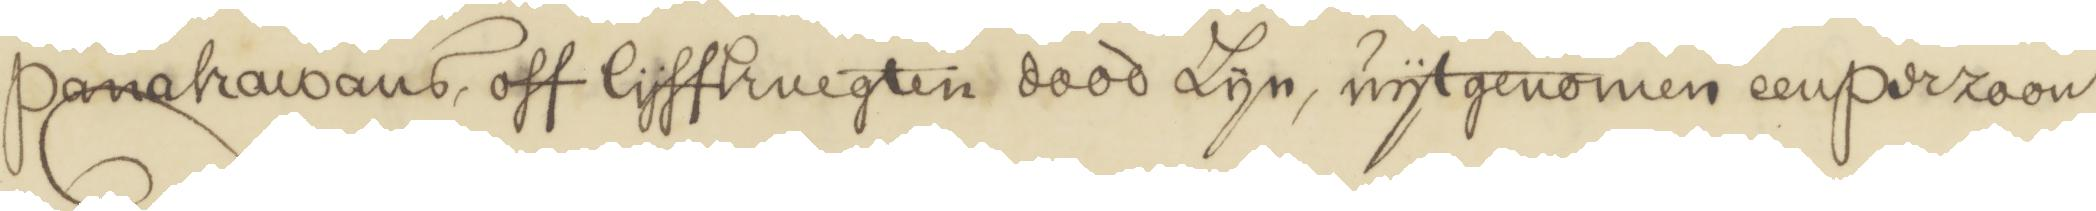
panakawans, off lijffknegten dood zijn, uijt genomen een perzoon
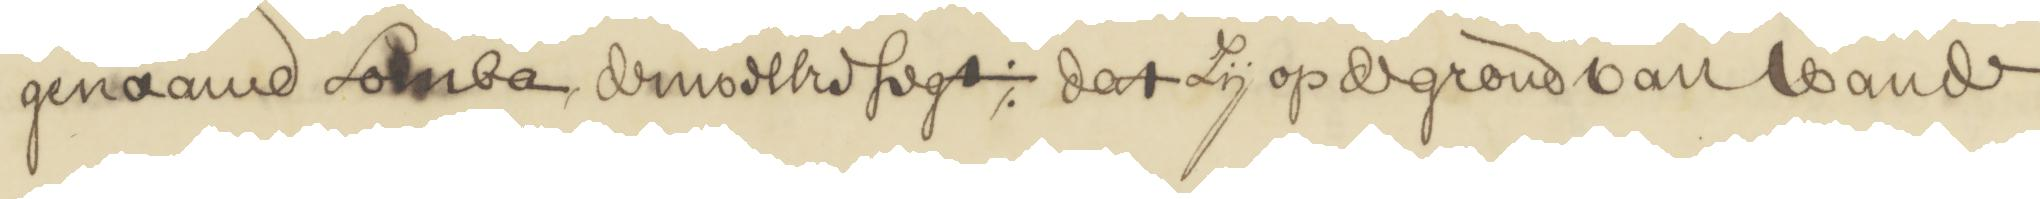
genaamd somba, dewelke segt; dat zij op de grond van wande
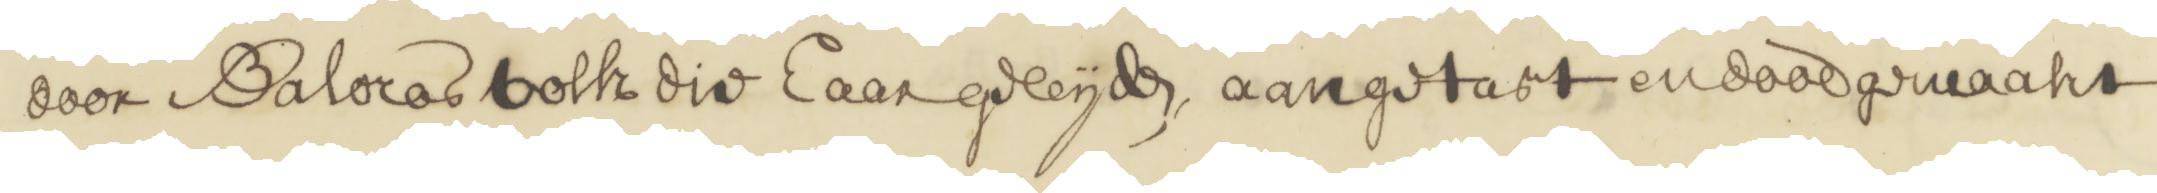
door Baloras volk die haar geleijden, aangetast en dood gemaakt
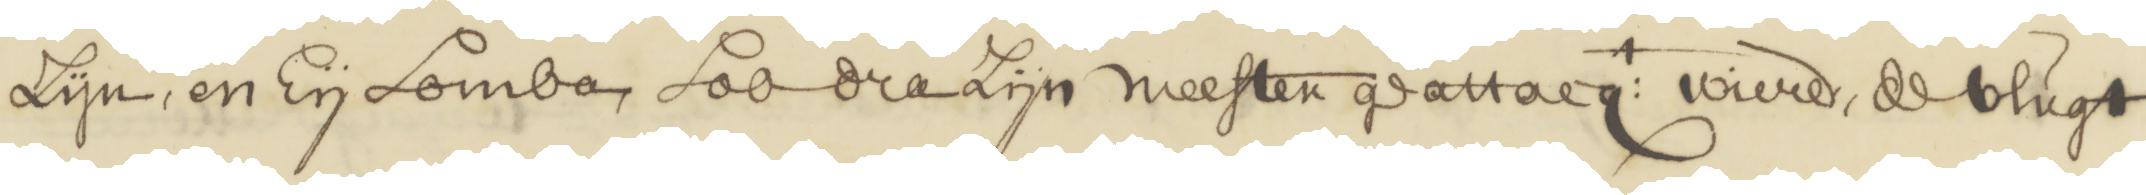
zijn, en hij somba, soodra zijn meester geattacq:t wierd, de vlugt
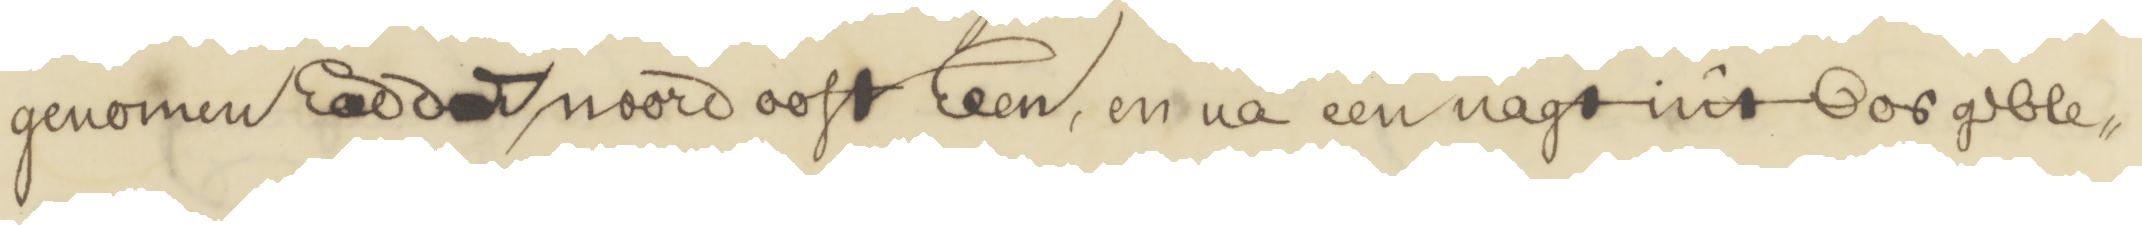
genomen hadde, noord oost heen, en na een nagt in't bos geble„
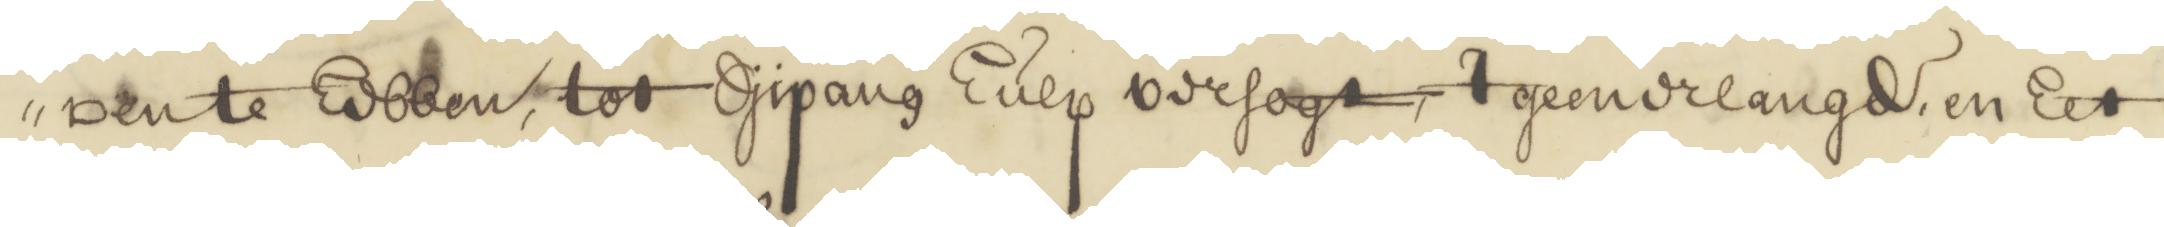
„ven te hebben, tot djipang hulp versogt, ’t geen erlangde, en het
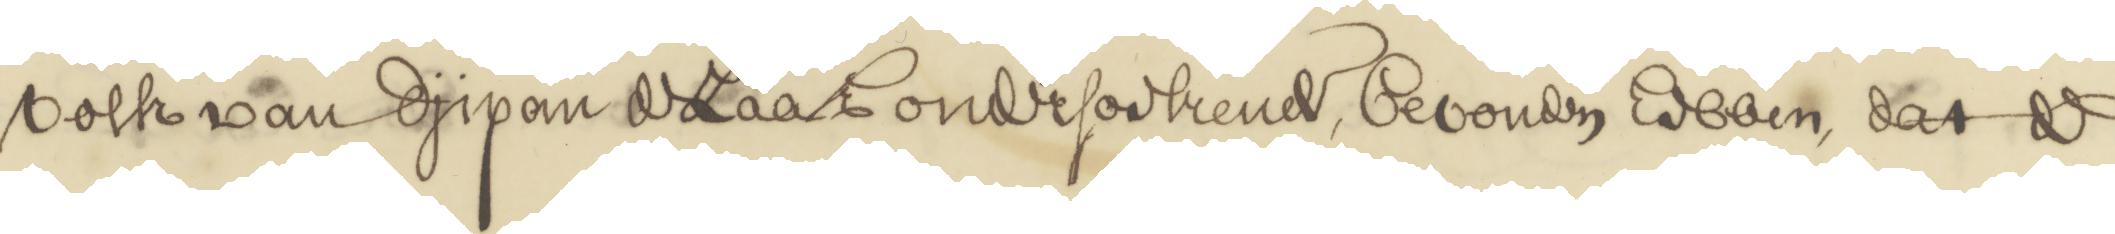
volk van djipan de zaak ondersoekende, bevonden hebben, dat de
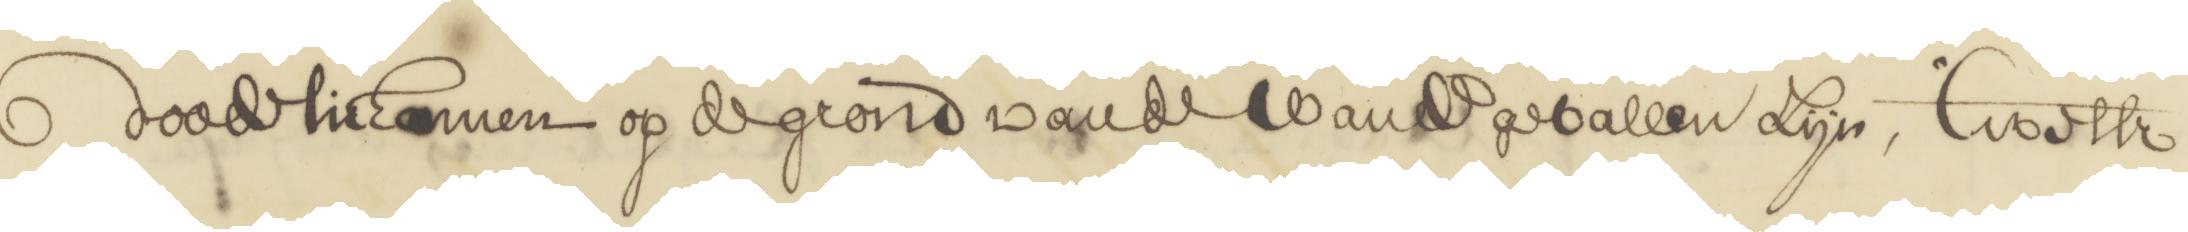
doode lichamen op de grond van de wande gevallen zijn, 'twelk
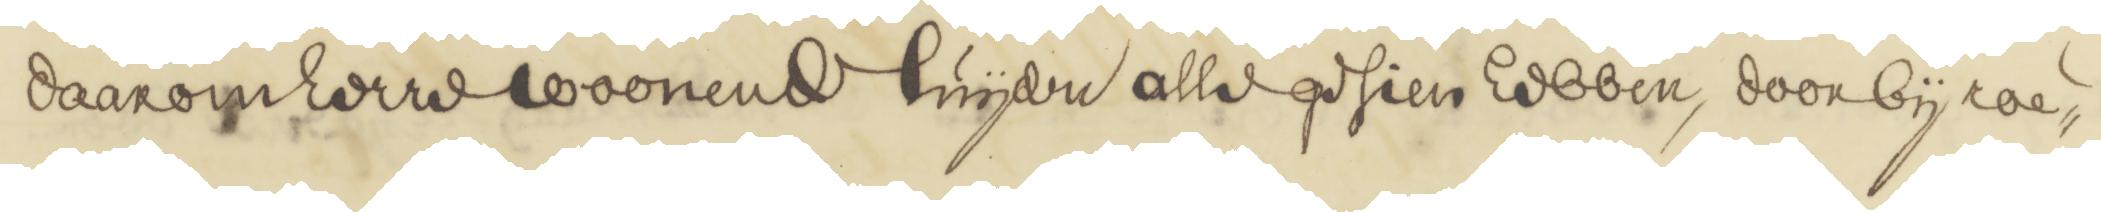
daar om herre woonende luijden alle gesien hebben, door bij roe„
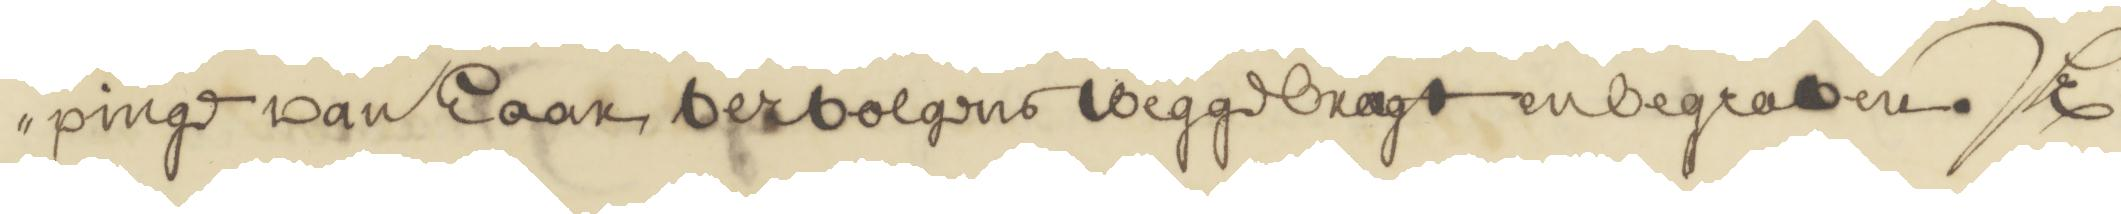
„pinge van haar vervolgens weggebragt en begraven. Jk
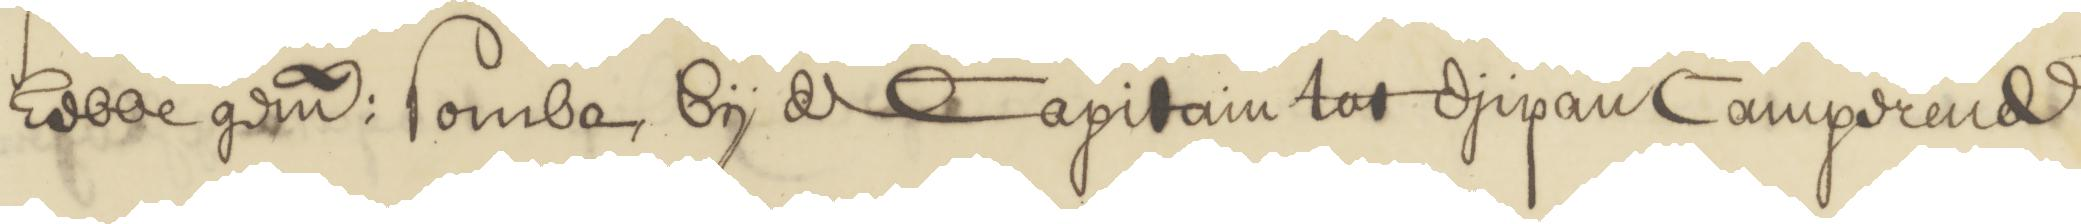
hebbe gem: somba, bij de Capitain tot djipan Camperende
